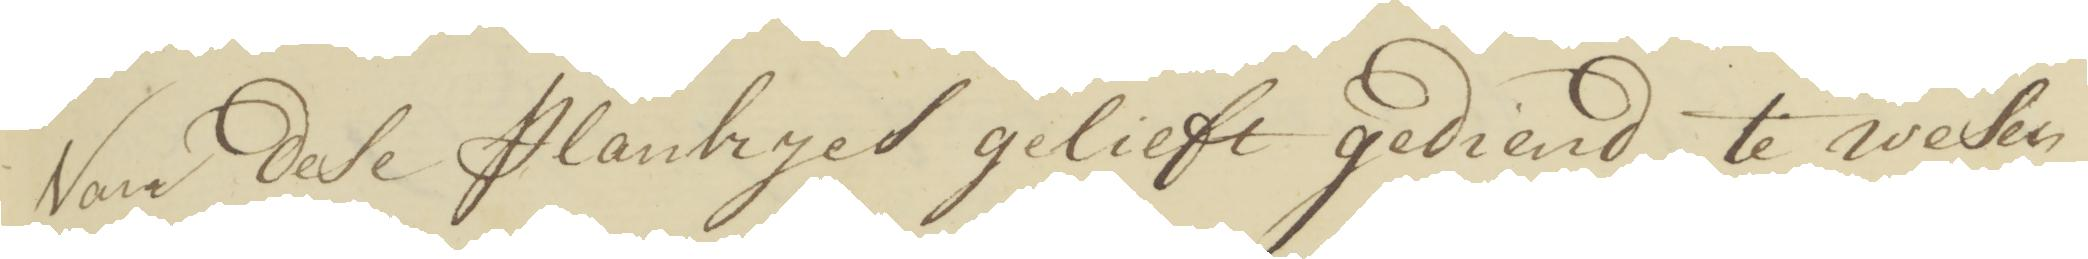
van dese plankjes gelieft gediend te wesen
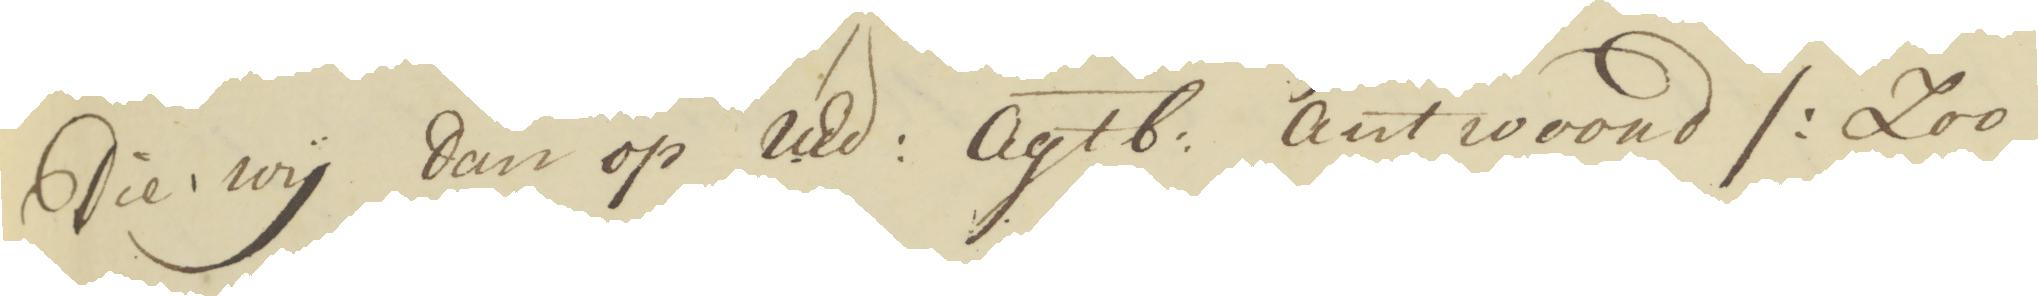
die wij dan op UEd: Agtb: antwoord /: zoo
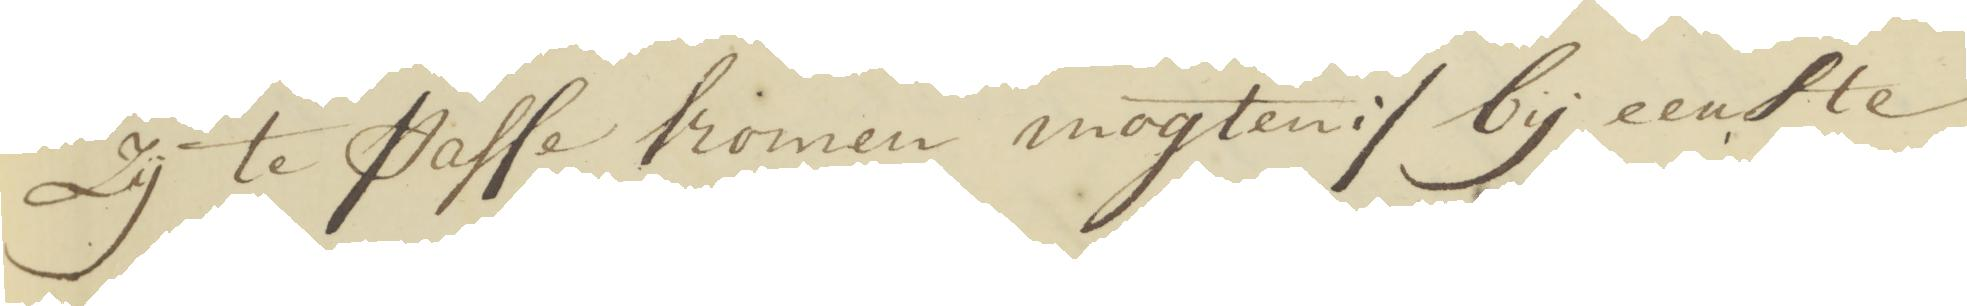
zij te passe komen mogten:/ bij eerste
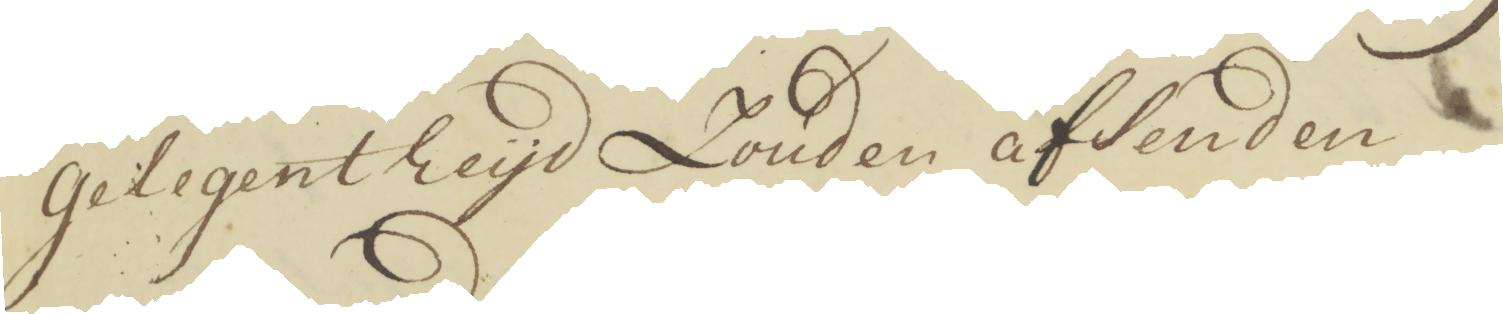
gelegentheijd zouden afsenden
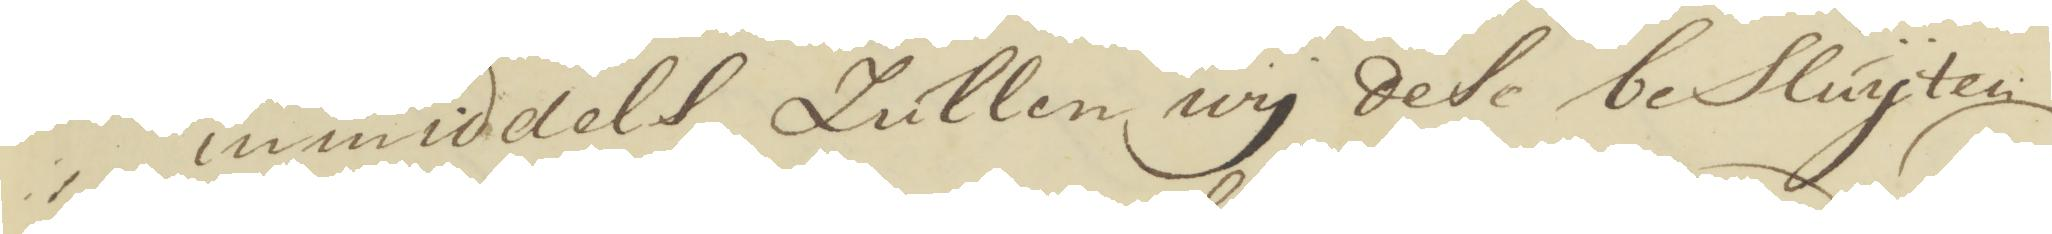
, inmiddels zullen wij dese besluijten
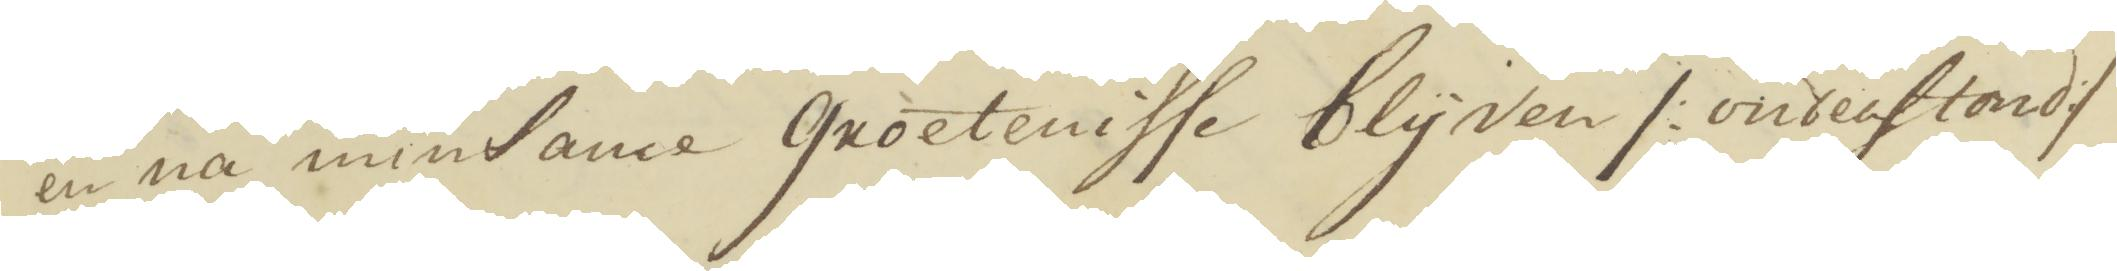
en na minsame groetenisse blijven /:onderstond:/
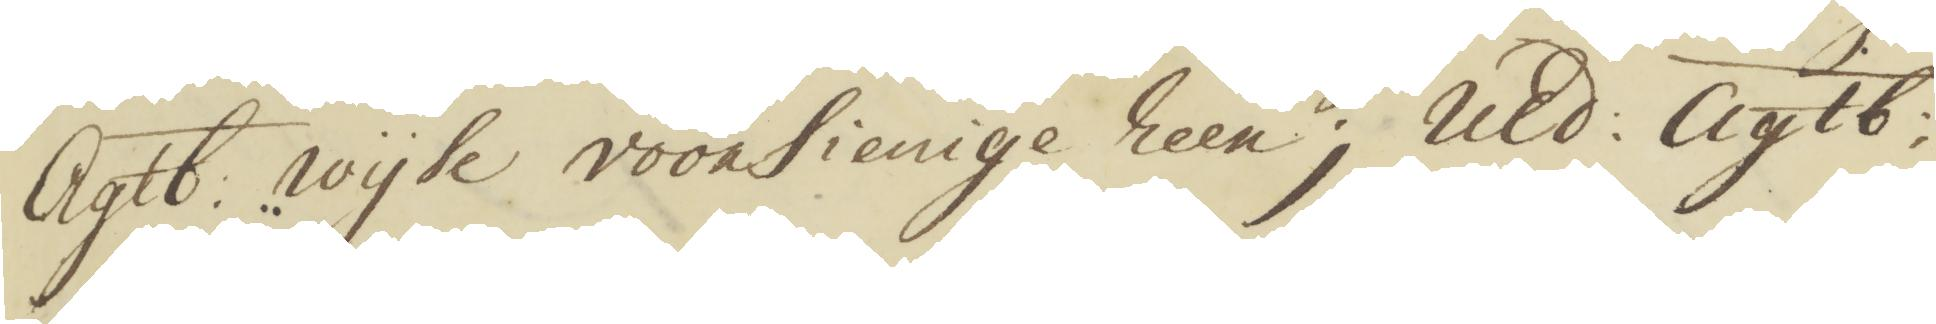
Agtb: wijse voorsienige heer; UEd: Agtb:
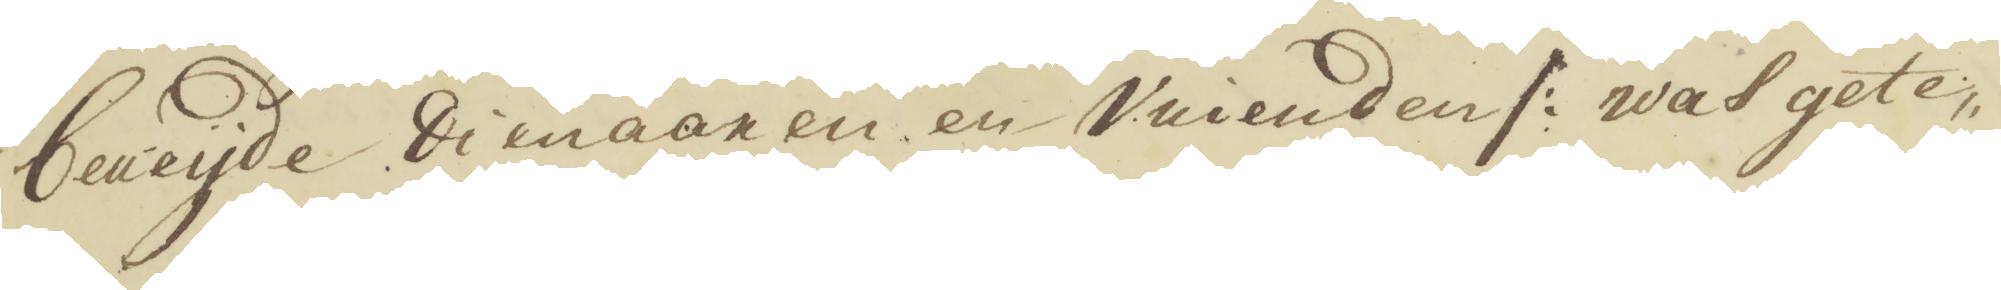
bereijde dinaaren en vrienden /: was gete„
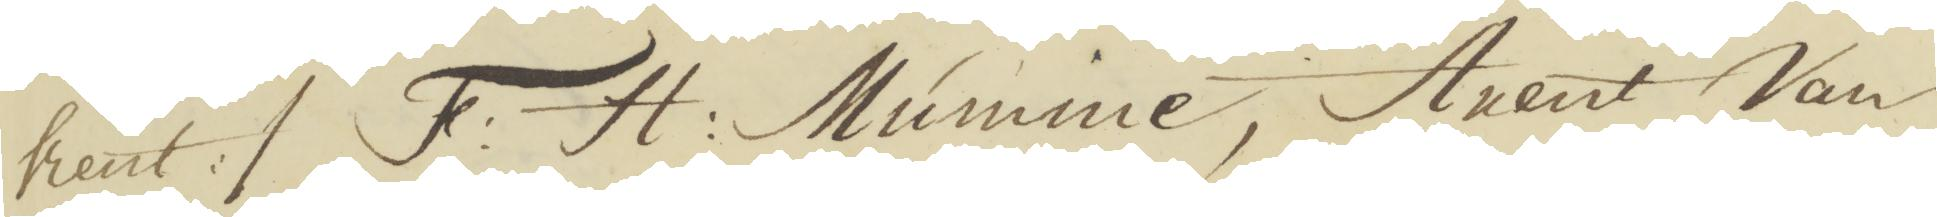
kent :/ F:H: Mumme, Arent van
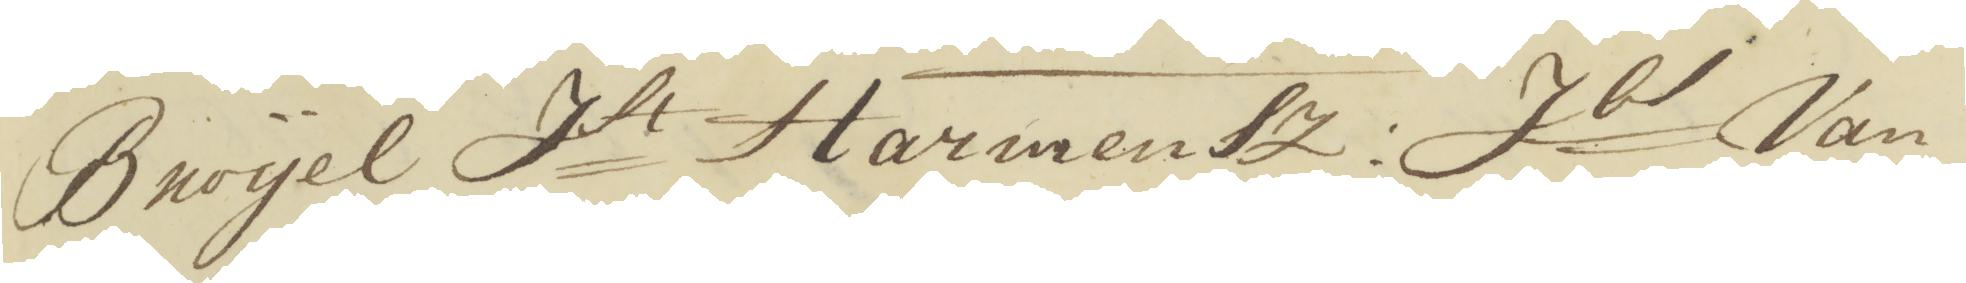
Broijel J=st Harmensz: J=bs van
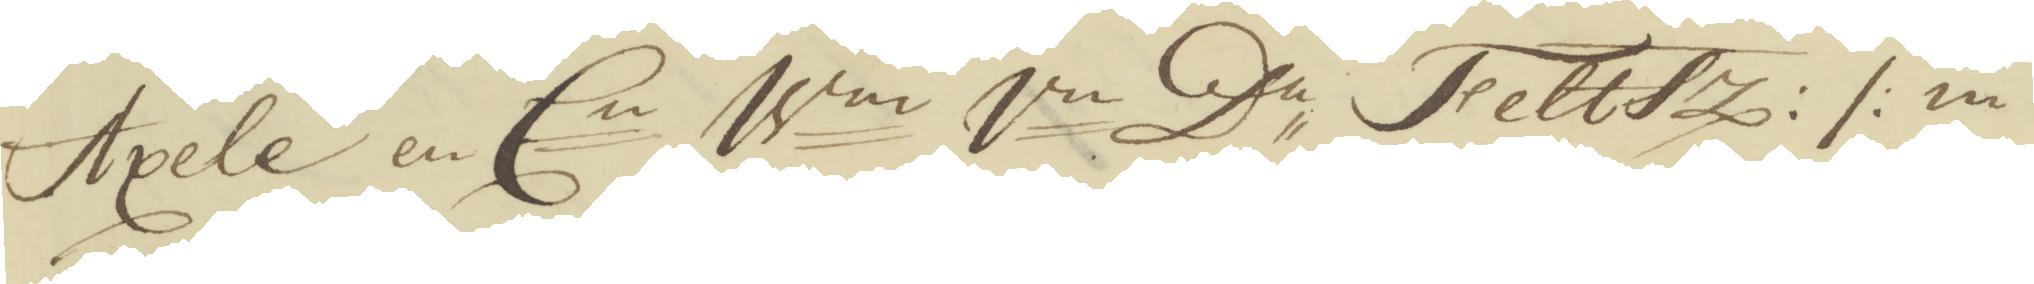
Axele en C=n W=m V=n D„r Feltsz: /: in
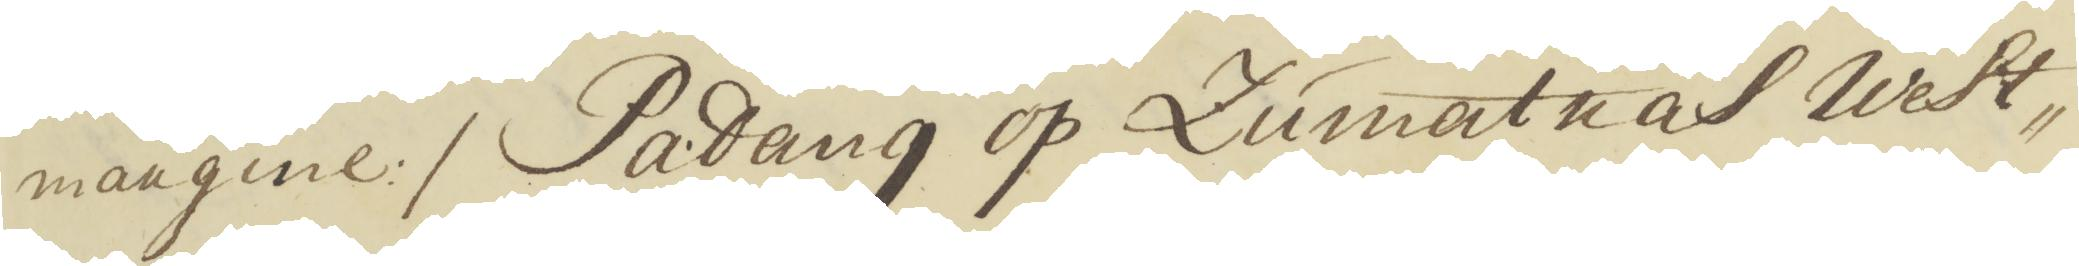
margine:/ Padang op Zumatras West„
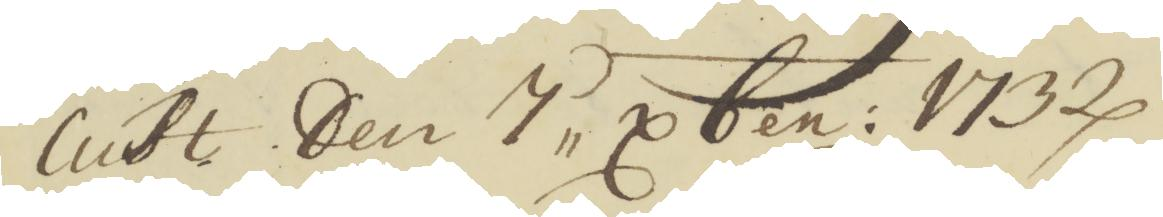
cust den 7„' xber: 1732
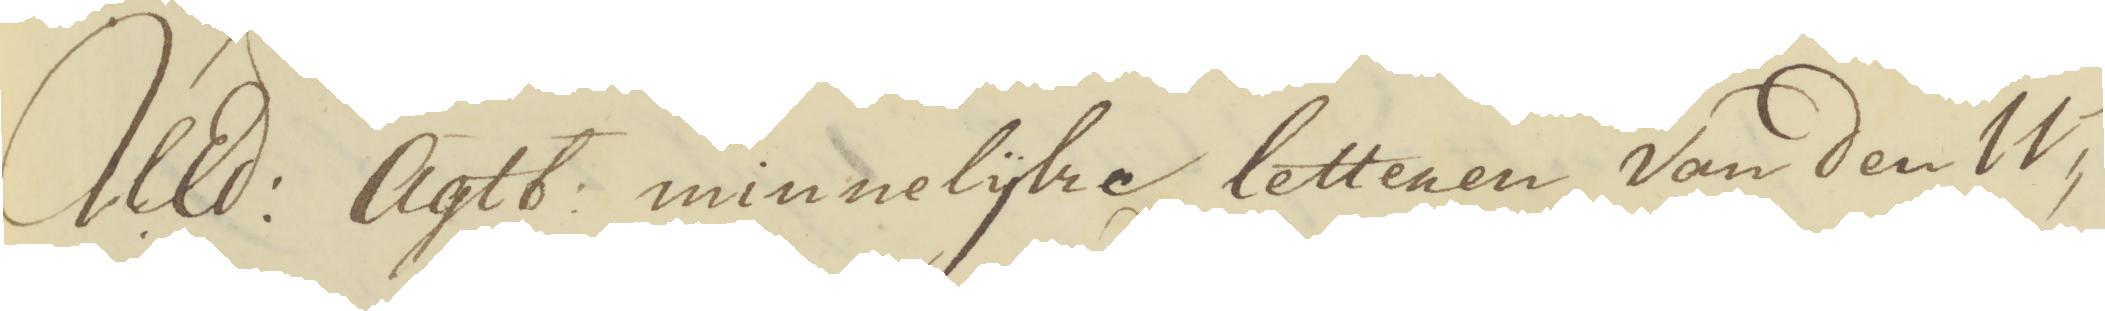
UEd: Agtb: minnelijke letteren van den 11„'
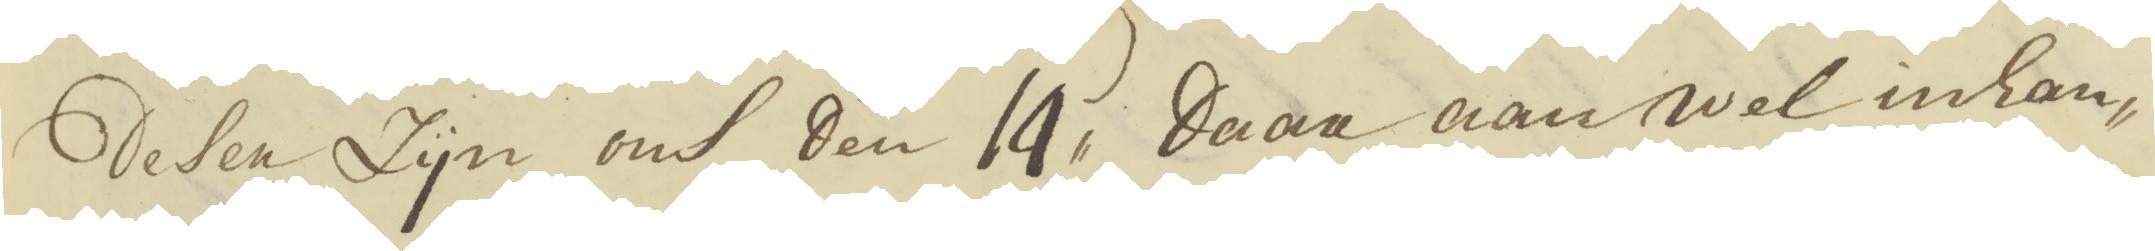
deser zijn ons den 14„' daar aan wel inhan„
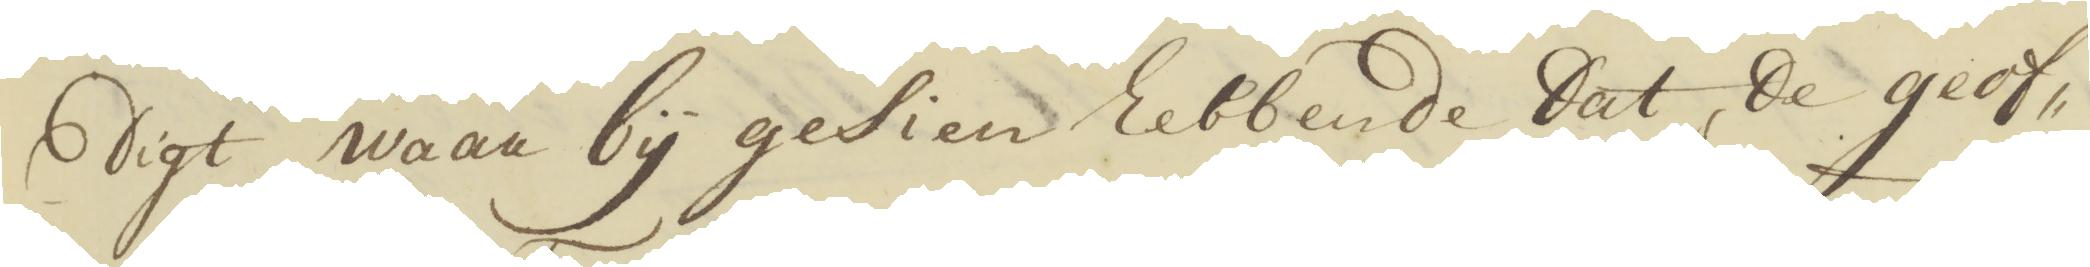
digt waar bij gesien hebbende dat de geof„
